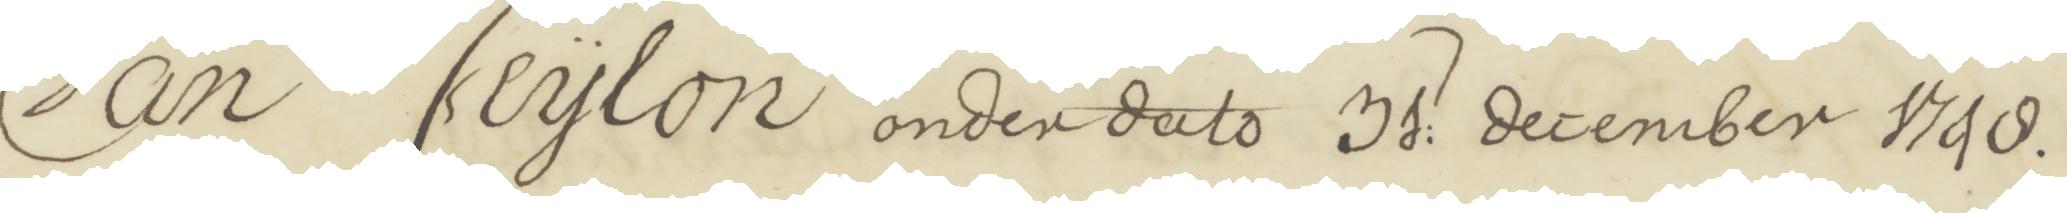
Van Ceijlon onder dato 31:' december 1748.
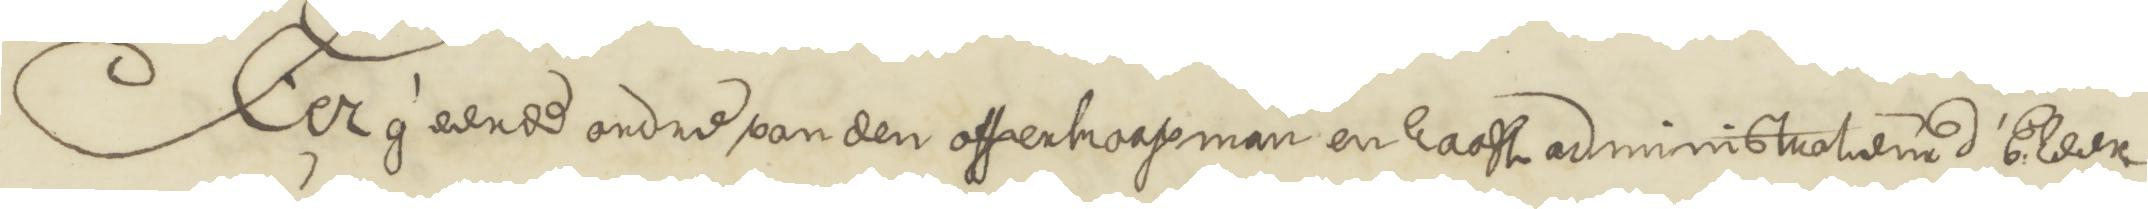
Ter g’eerde ordre van den opperkoopman en hooft administrateur d’ E: heer
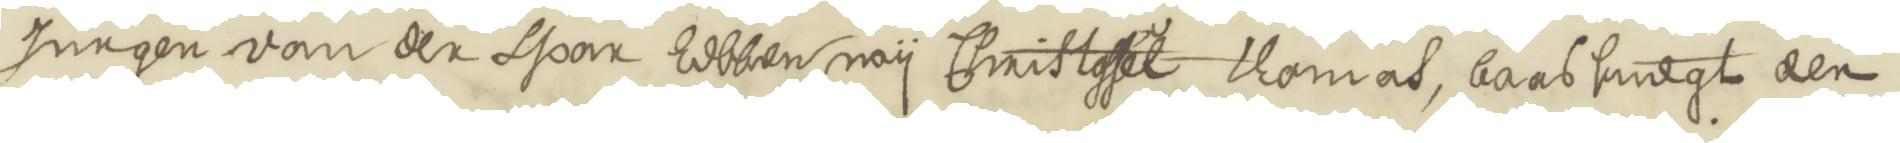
Jurgen van der spar hebben wij Christoffel thomas, baas knegt der
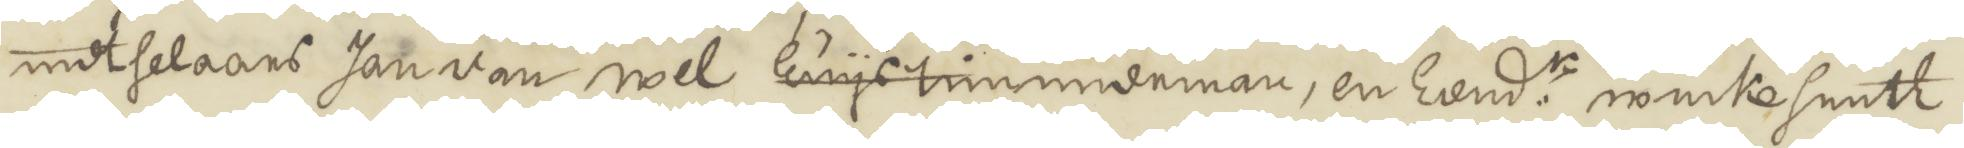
metselaars Jan van wel huijstimmerman, en hend:k winke smith
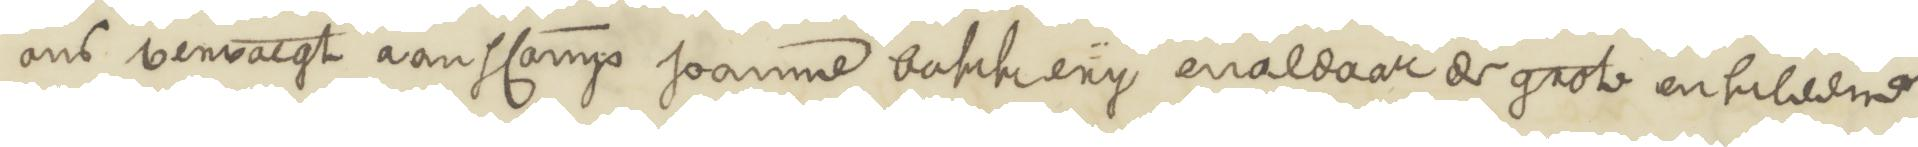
ons vervoegt aan sComp panne bakkerij en aldaar de grote en kleene
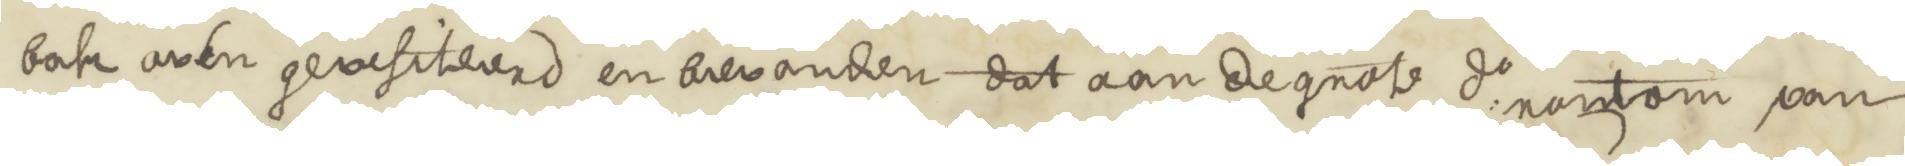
bak oven gevisiteerd en bevonden dat aan de grote d:o rontom van
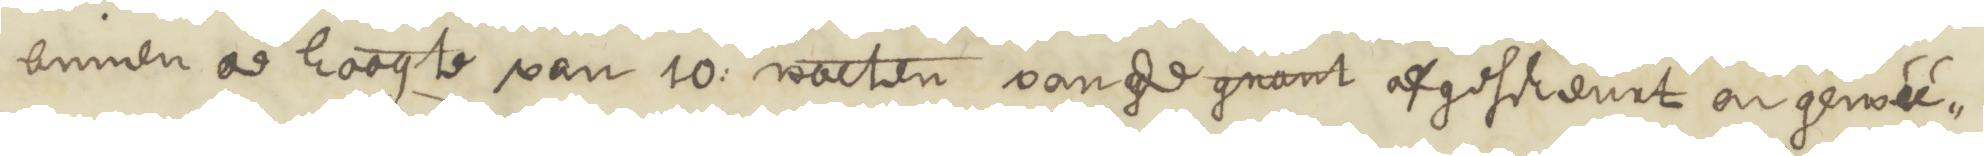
binnen de hoogte van 10: vaeten van de gront afgescheurt en gewee„
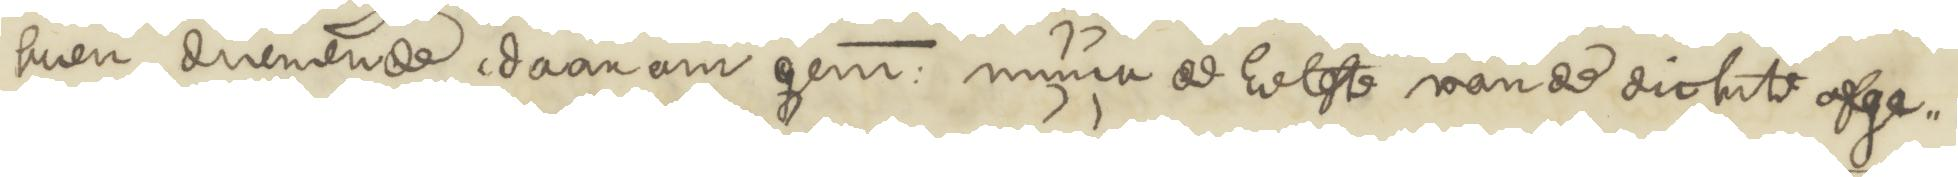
ken dienende daar om gem: muur de helfte van de dickte afga„
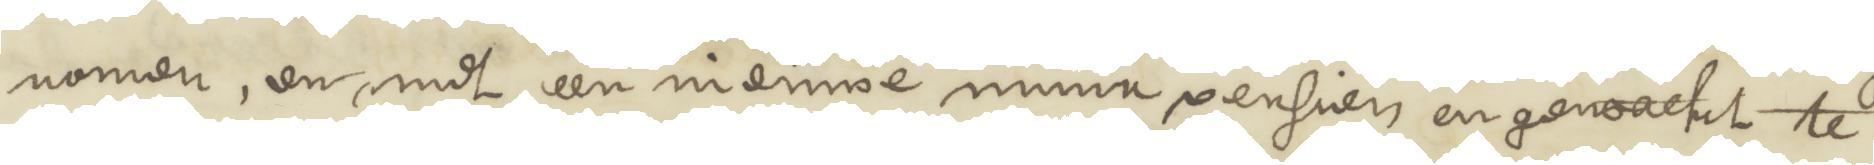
nomen, en met een nieuwe muur versien en gemaekt te
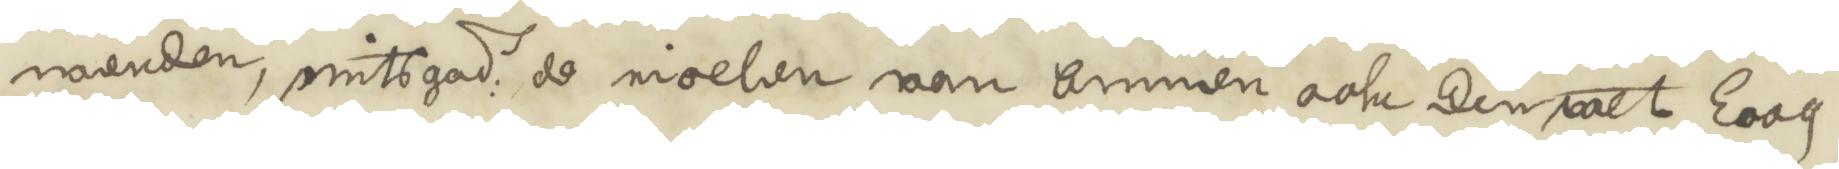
werden, mitsgad:s de riollen van binnen ook Een voet hoog
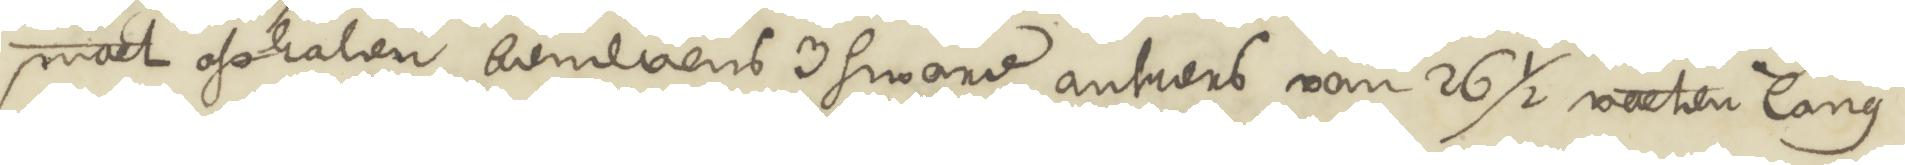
moet ophalen benevens 3 sware ankers van 26½ voeten lang
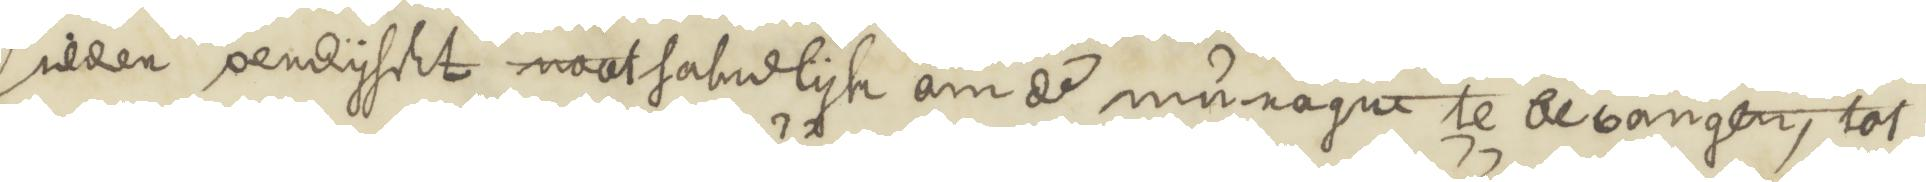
ieder vereijscht nootsakelijk om de muragie te bevangen, tot
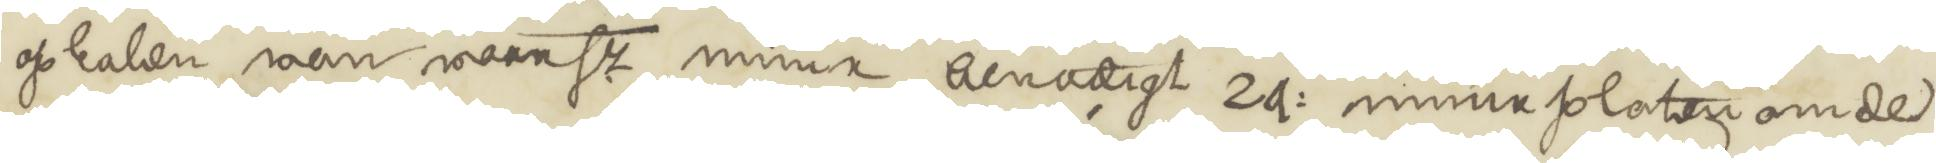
op halen van voorsz muur benodigt 24: muur platen om de
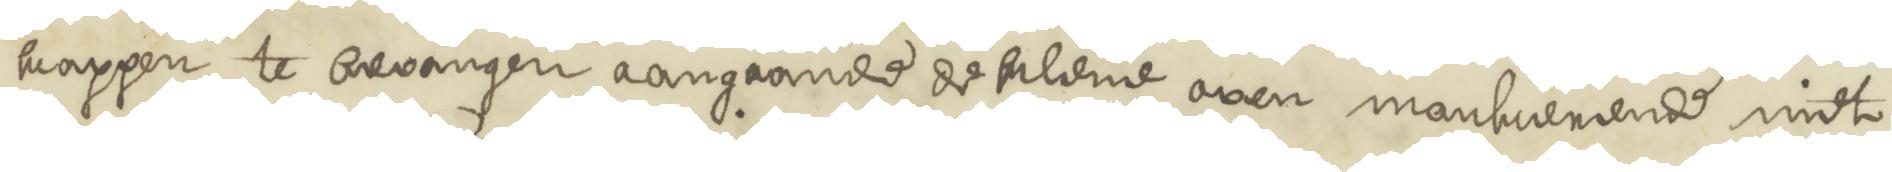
kappen te bevangen aangaande de klene over mankerende niet
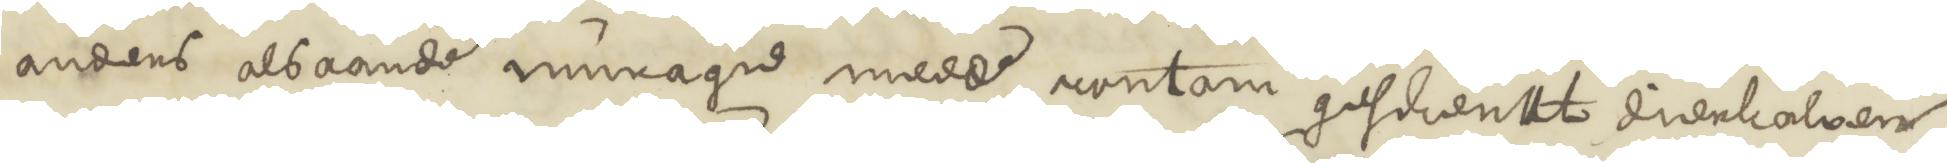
anders als aande muragie meede rontom gescheurt dierhalven
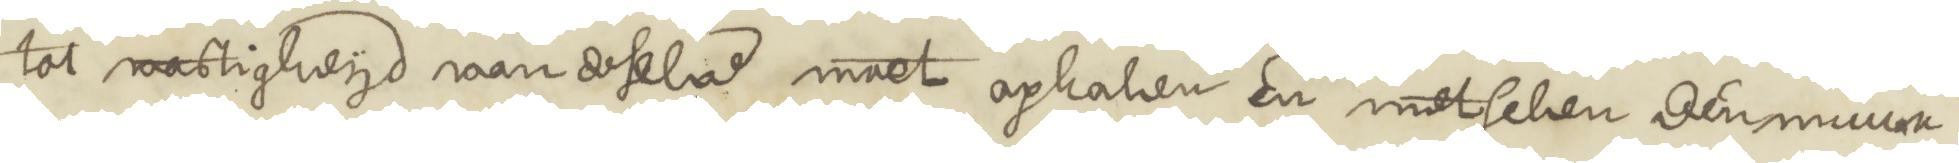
tot vastigheijd van deselve moet ophalen en metselen Een muur
